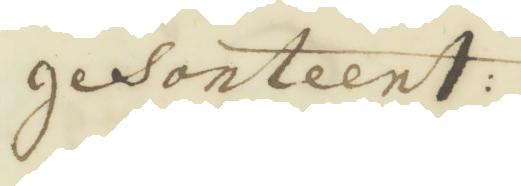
gesorteert:
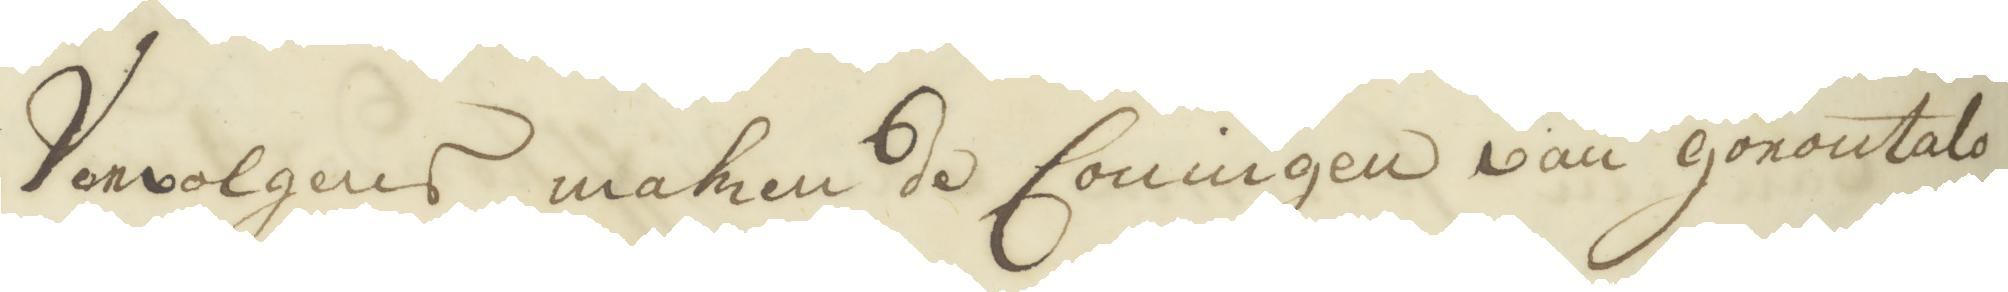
Vervolgens maken de Coningen van gorontalo
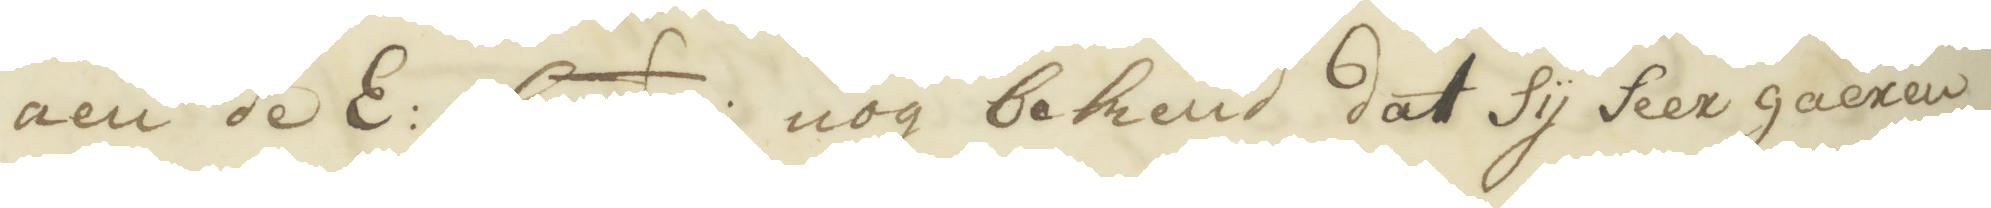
aen de E: Comp: nog bekend dat sij seer gaeren,
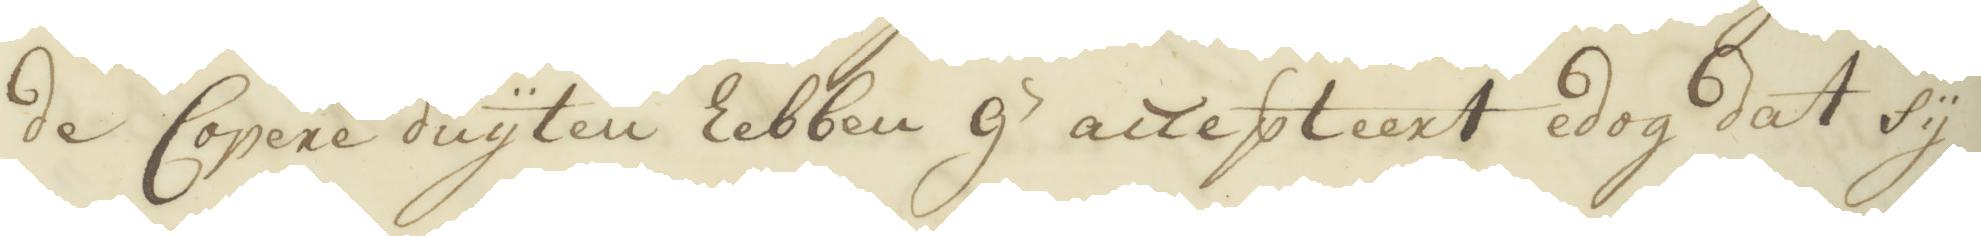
de Copere duijten hebben g’accepteert edog dat sij
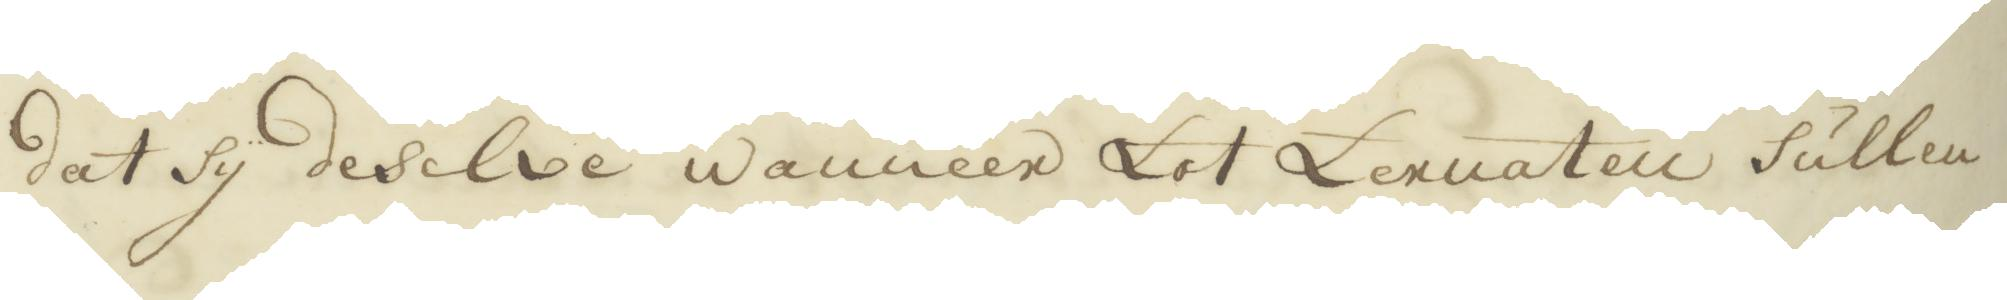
dat sij deselve wanneer tot ternaten sullen
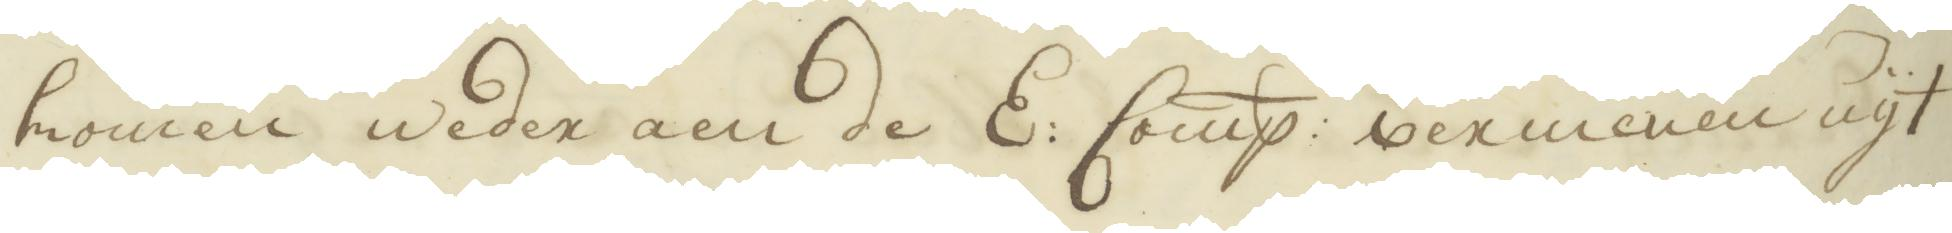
komen weder aen de E: Comp: vermenen uijt
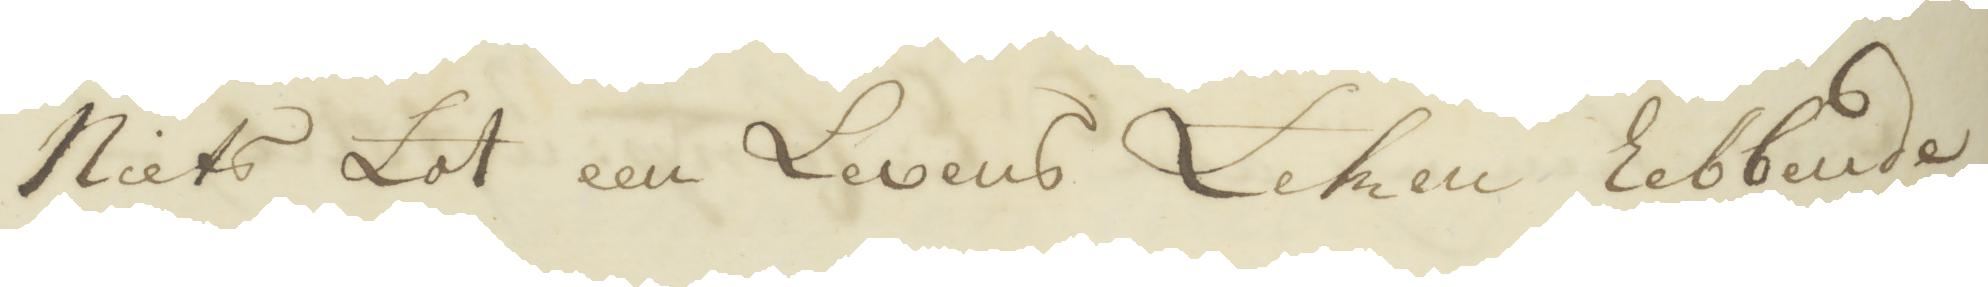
Niets tot een Levens Teken hebbende
